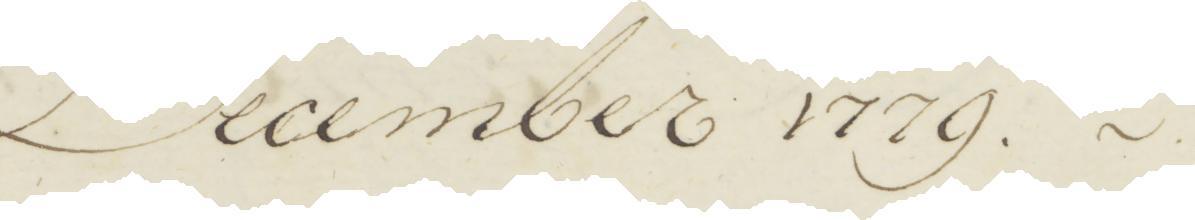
December 1779. ⁓
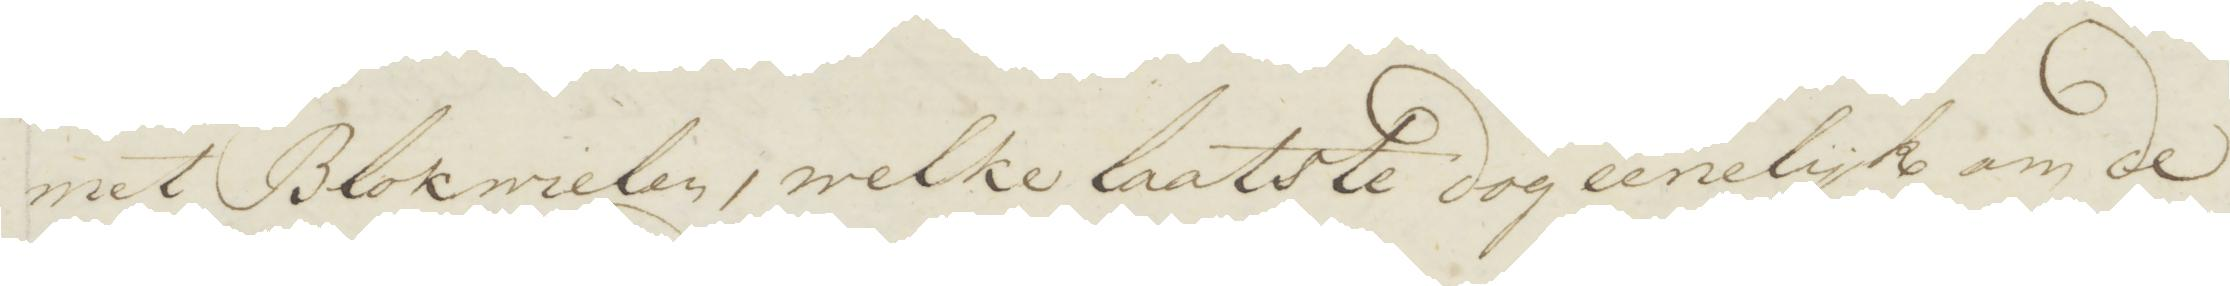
met Blokwielen, welke laatste dog eenelijk om de
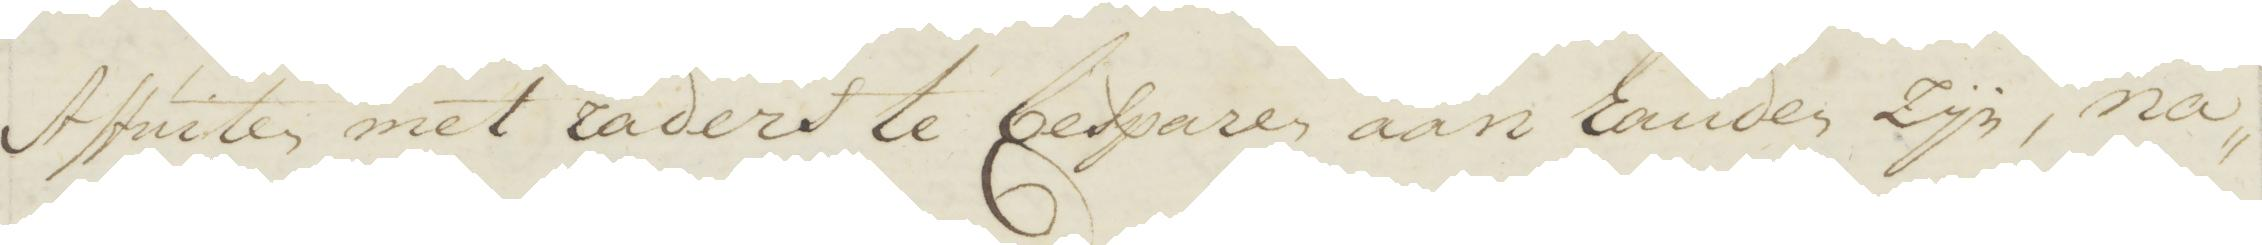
Affuiten met raders te besparen aan handen zijn, na„
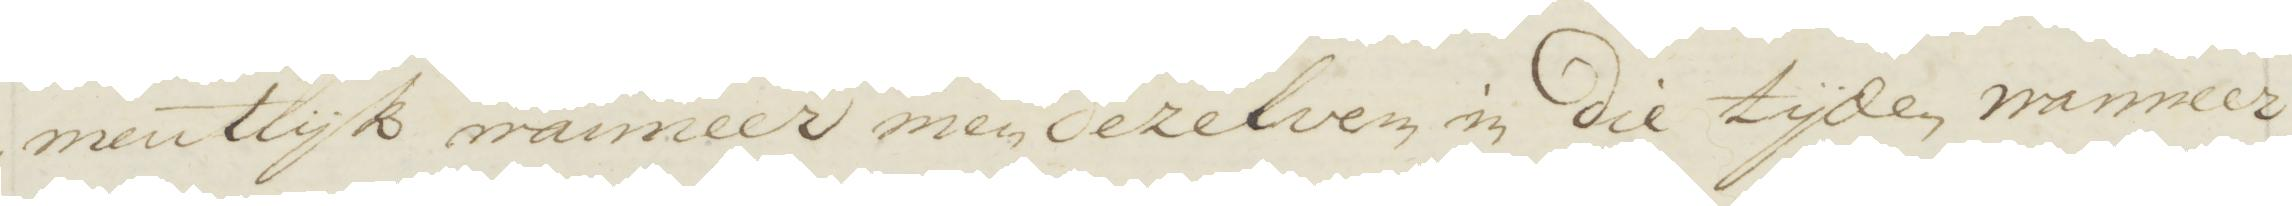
mentlijk wanneer men dezelven in die tijden wanneer
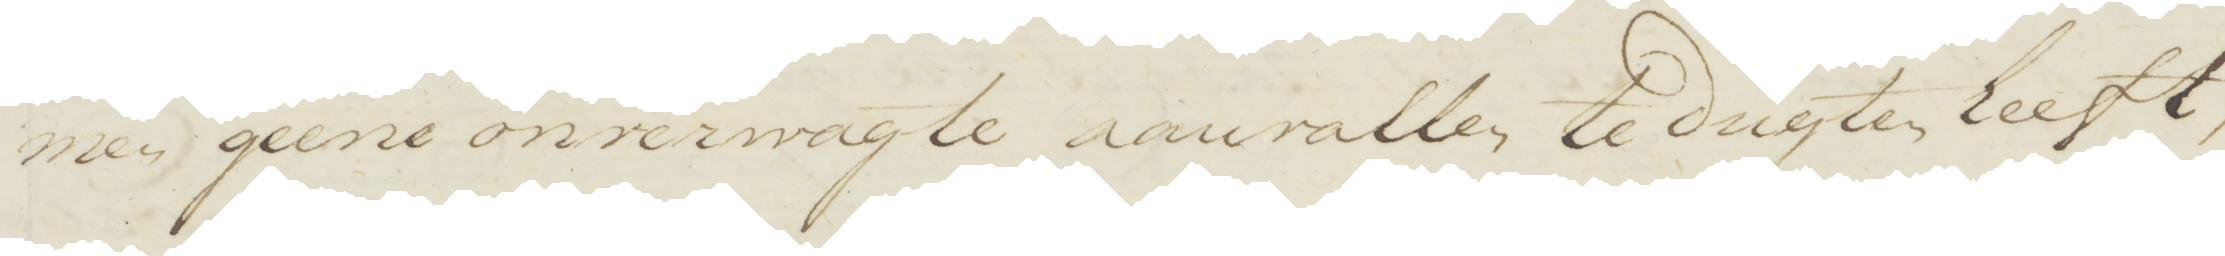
men geene onverwagte aanvallen te dugten heeft,
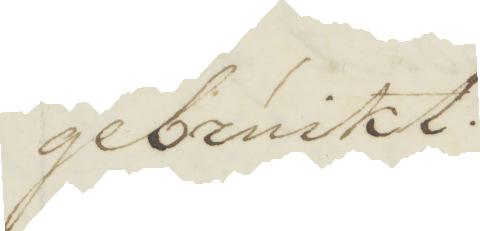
gebruikt.
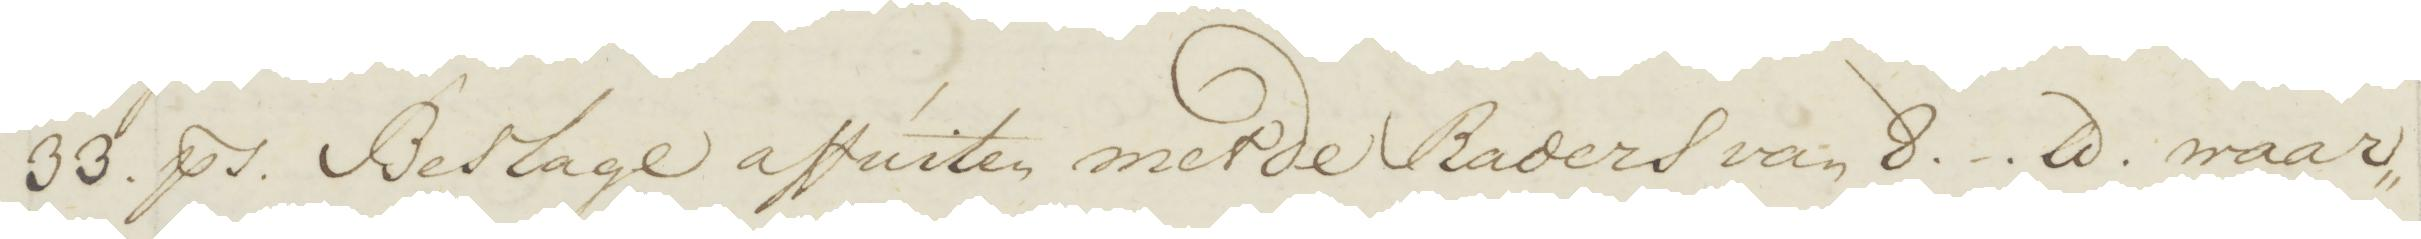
35. ps. Beslage affuiten met de Raders van 8.–. ld. waar„
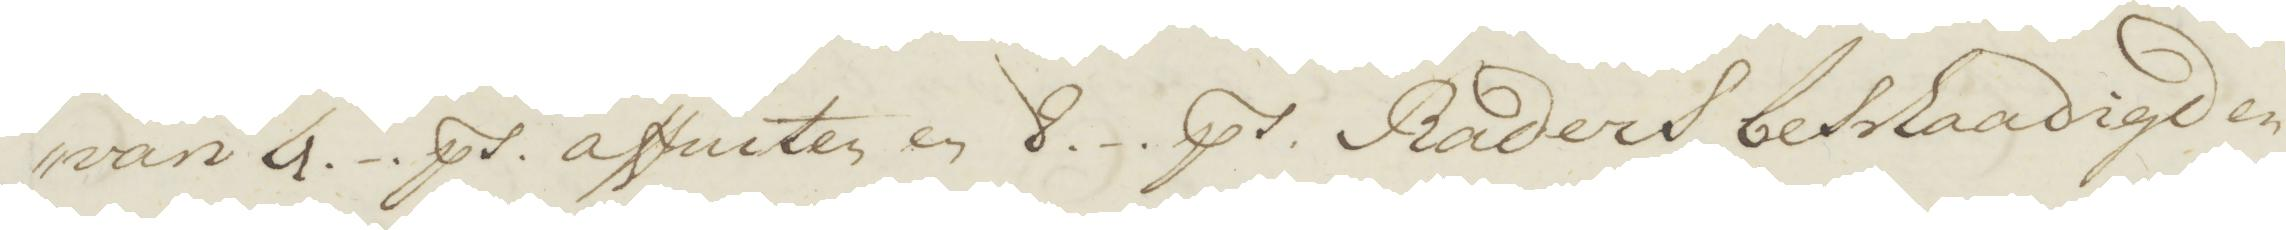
„van 4.–. ps. affuiten en 8.–. ps. Raders beschaadigd en
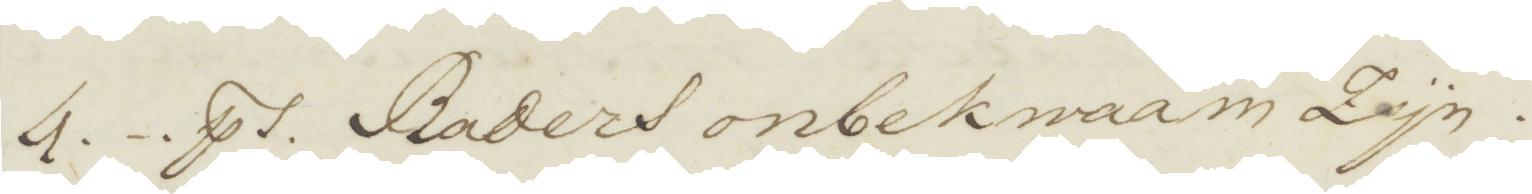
4.–. ps. Raders onbekwaam zijn.
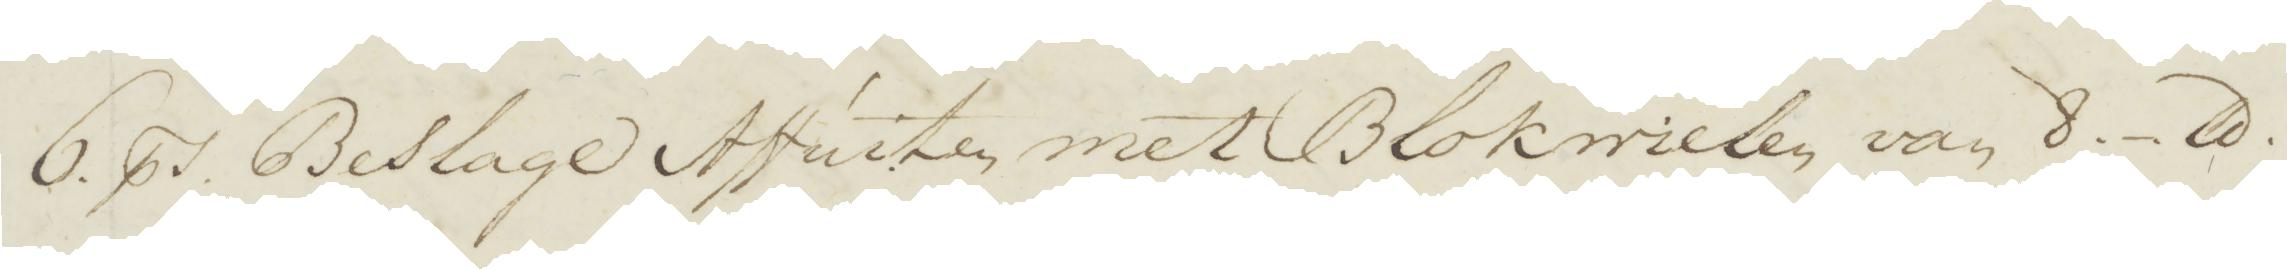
6. ps. Beslage Affuiten met Blokwielen van 8.-. ld.
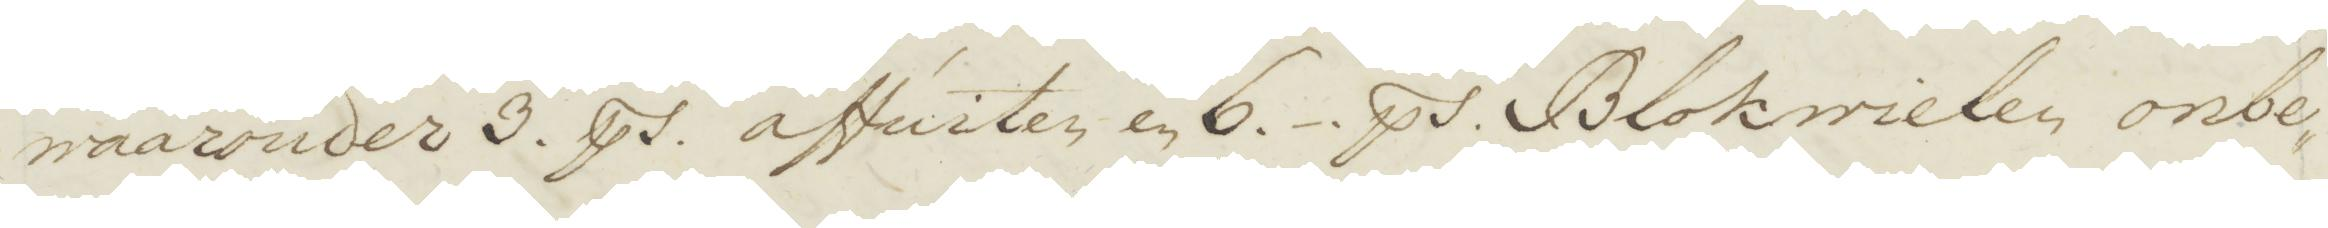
waaronder 5. ps. affuiten en 6.–. ps. Blokwielen onbe„
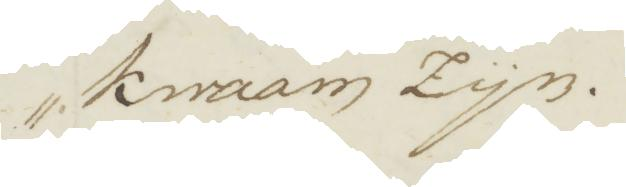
„kwaam zijn.
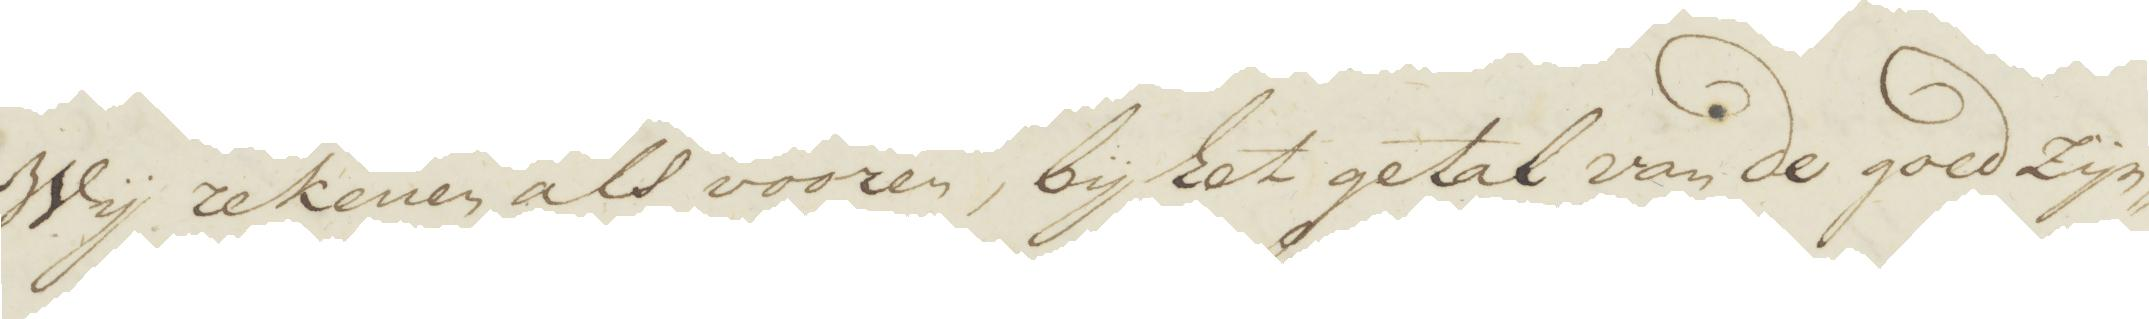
Wij rekenen als vooren, bij het getal van de goed zijn„
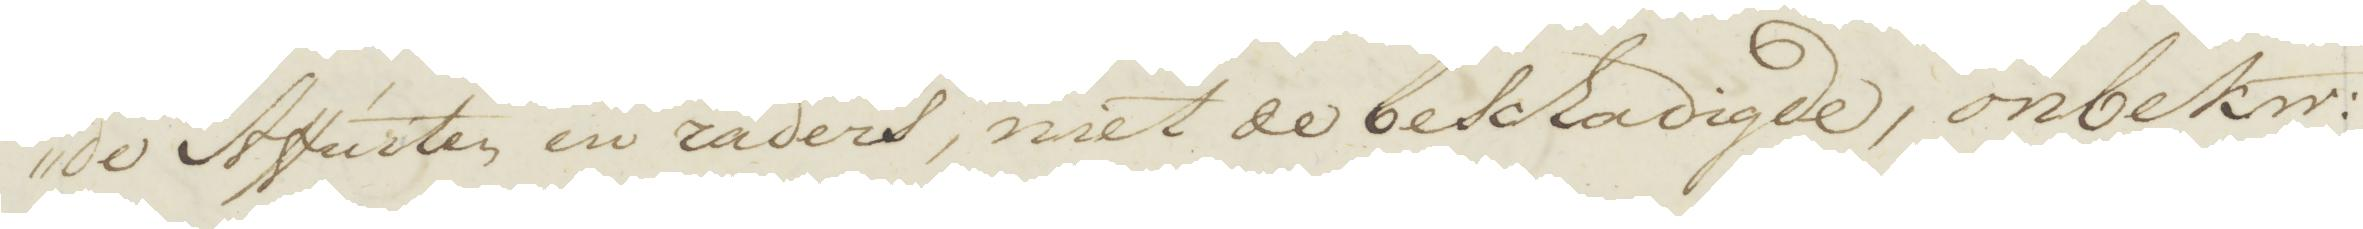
„de Affuiten en raders, niet de beschadigde, onbekw:
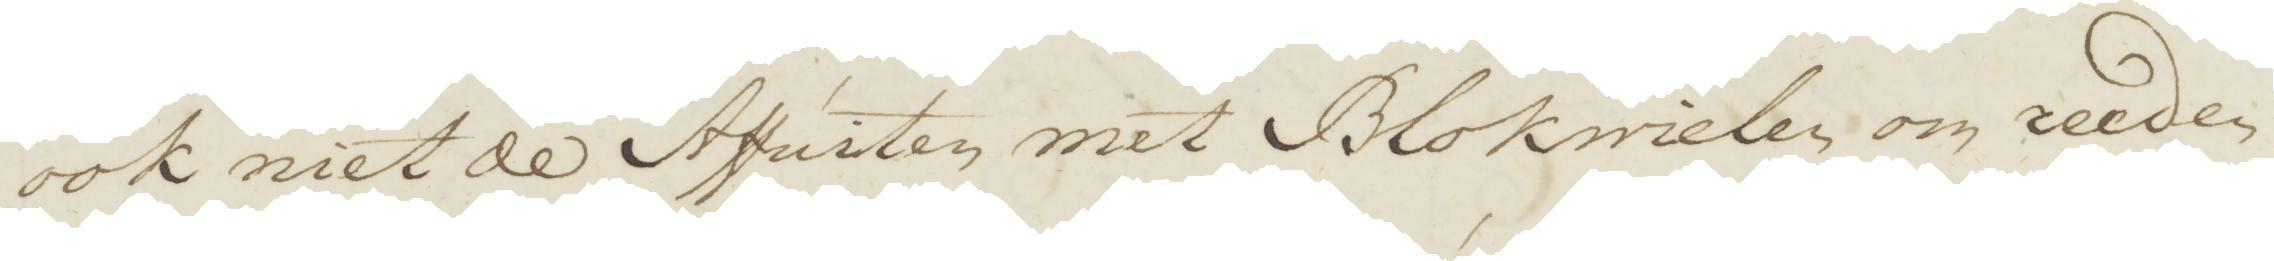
ook niet de Affuiten met Blokwielen om reeden
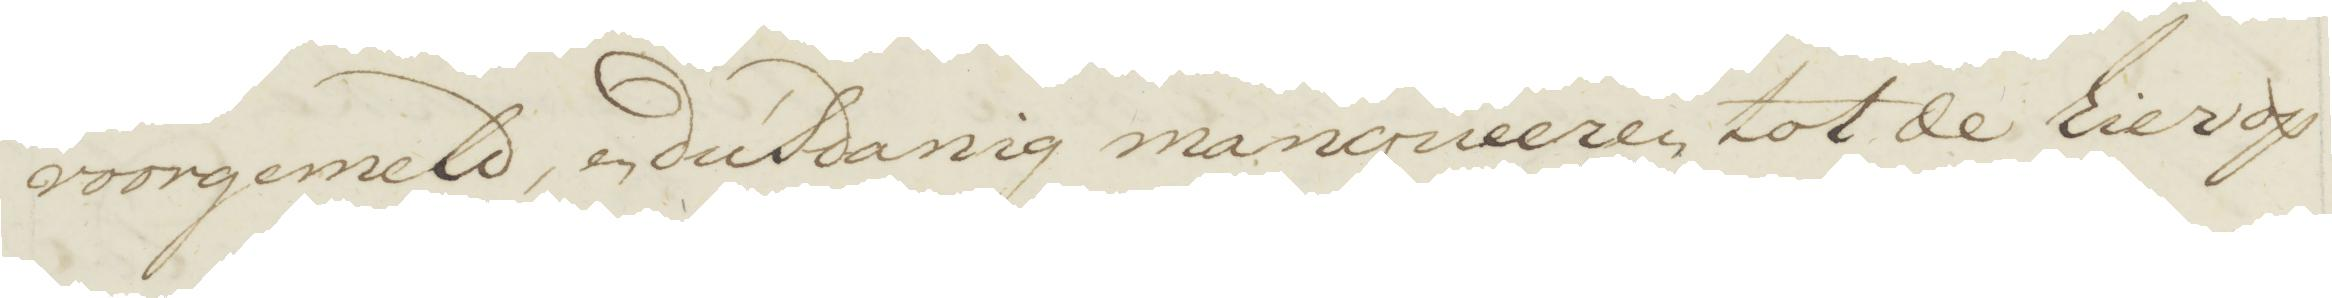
voorgemeld, en dusdanig manqueeren tot de hier op
